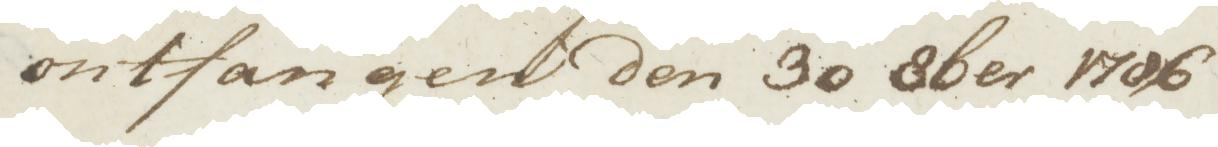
ontfangen den 30 8ber 1786
